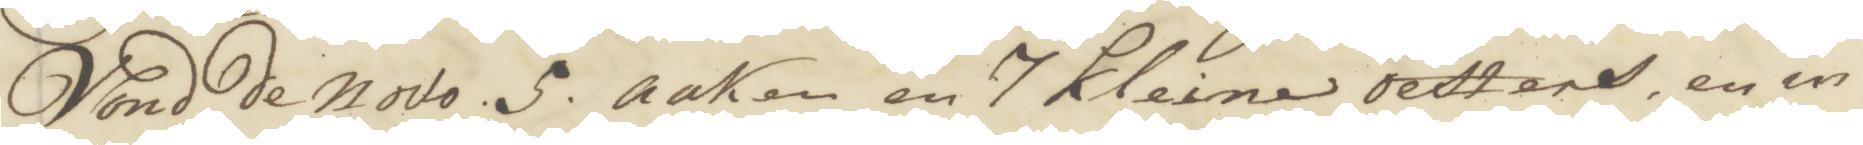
Vond de novo. 5. aaken en 7 kleine oesters, en in
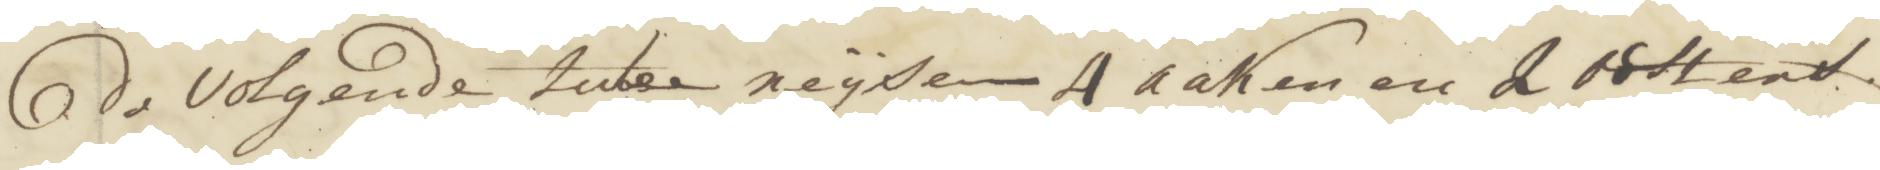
de volgende twee reijsen 4 aaken en 2 oesters.
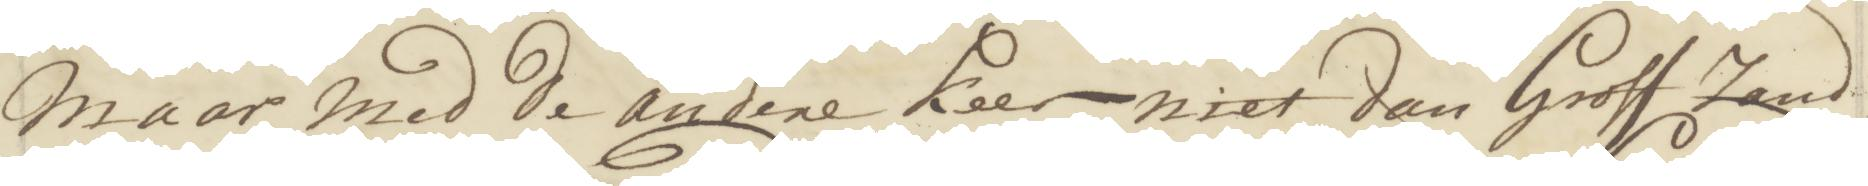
Maar med de andere keer niet dan Groff Zand
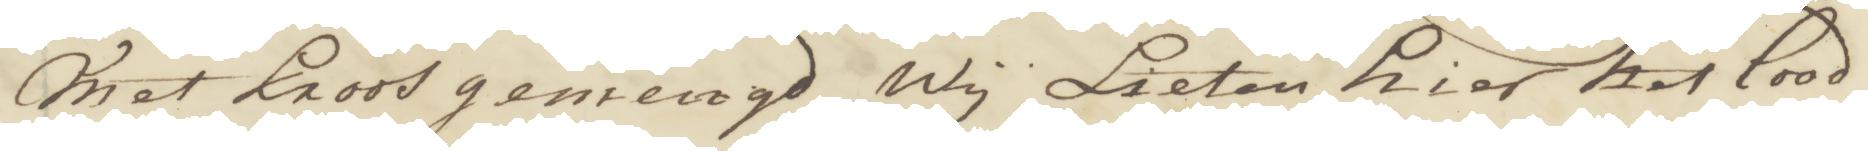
Met kroos gemengd wij Lieten hier het lood
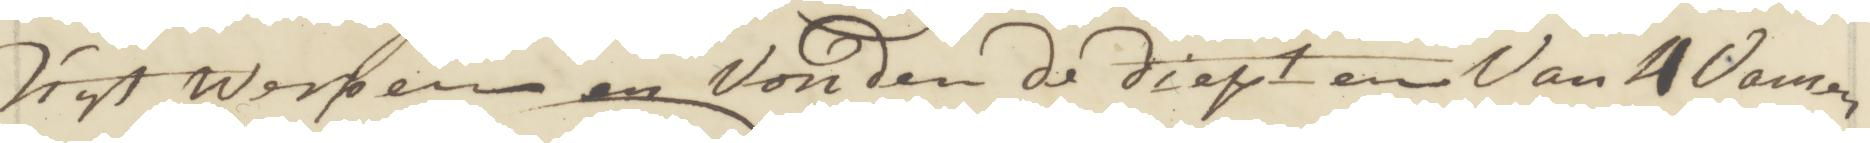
Vijt werpen en vonden de diepten Van 4 Vamen
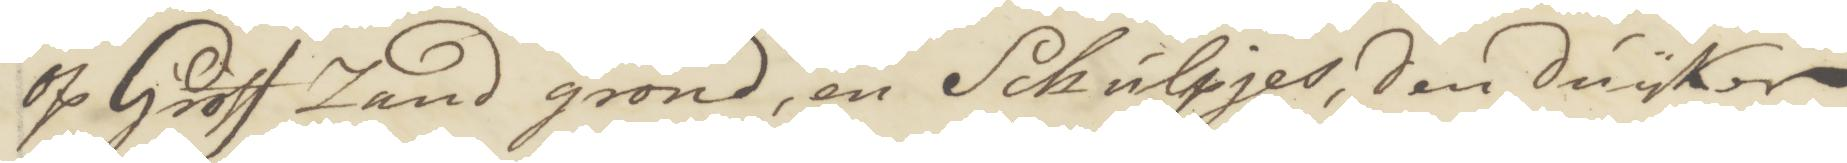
op Groff zand grond, en schulpjes, den duijker
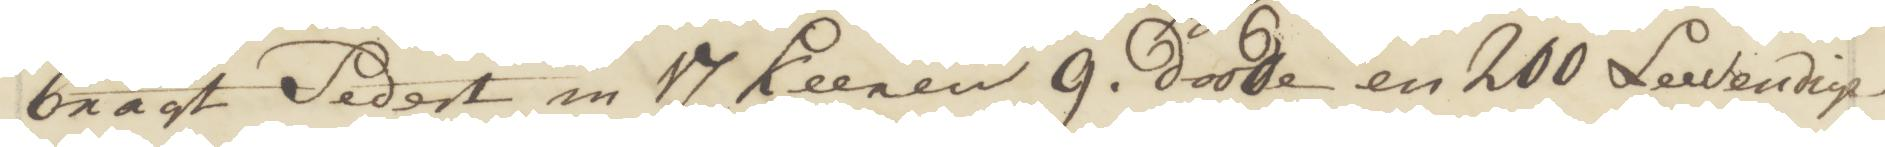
bragt sedert in 17 keeren 9. doode en 200 Leevendige
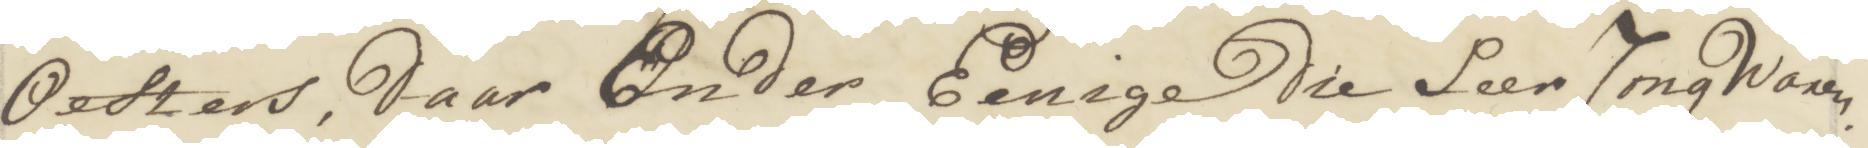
Oesters, daar Onder Eenige die seer Jong Waren
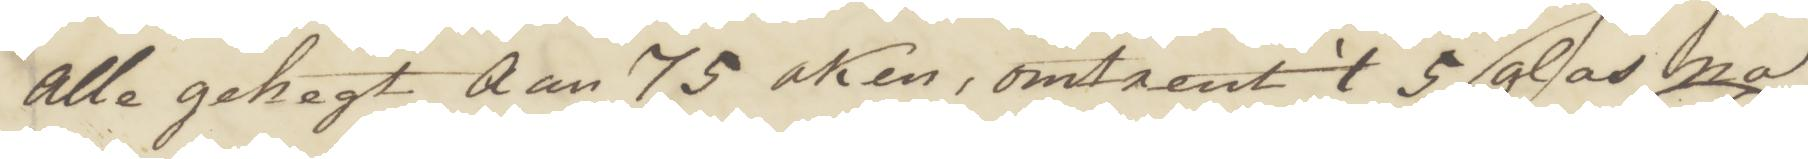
Alle gehegt Aan 75 aken, omtrent ’t 5 glas na
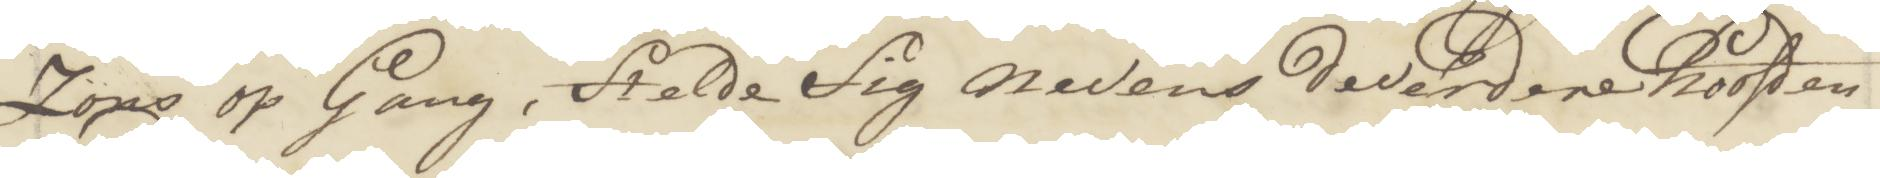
zons op Gang, stelde sig nevens deverdere hoofden
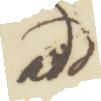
add
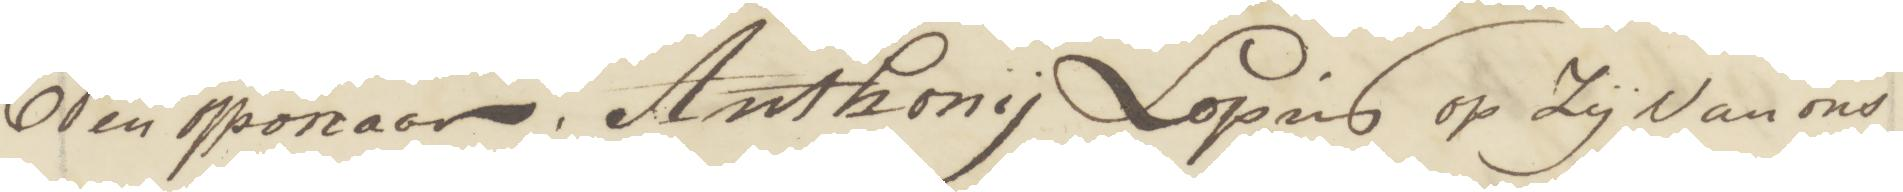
den opponaar, Anthonij Lopus op zij Van ons,
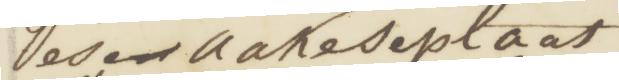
desen Aakeseplaat
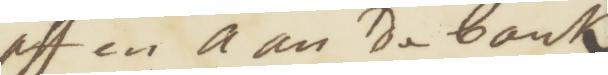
aff en Aan de bank
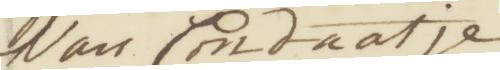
Van Condaatje
